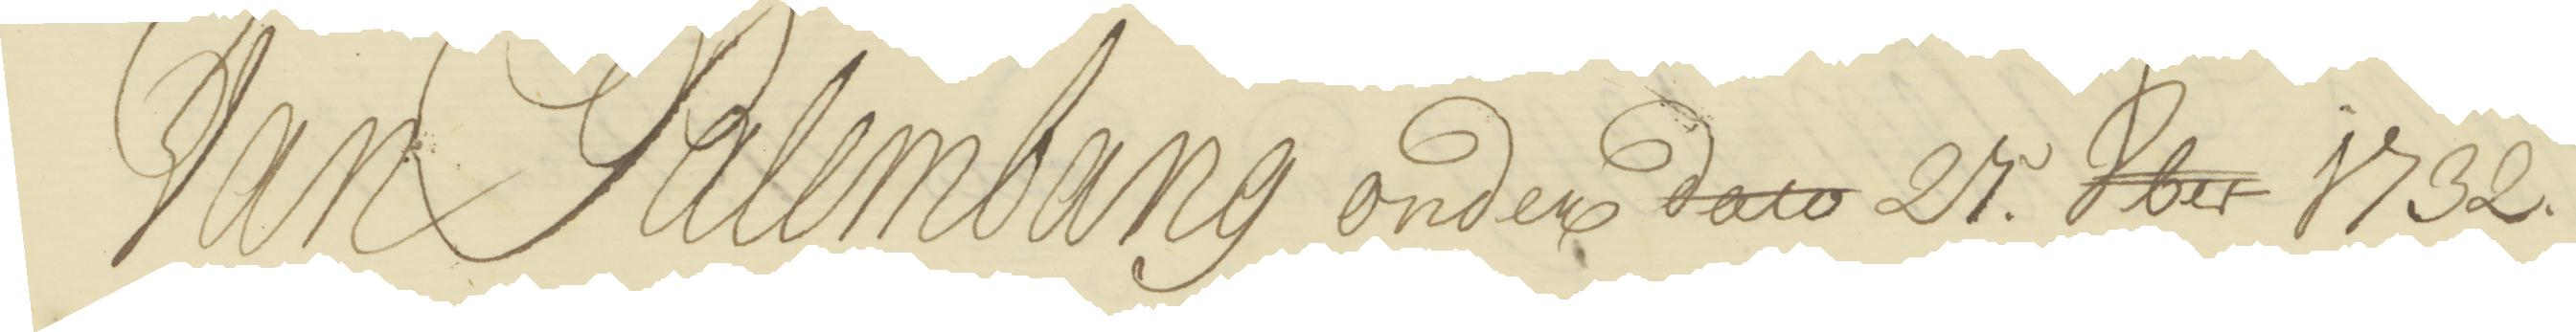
Van Palembang onder dato 27:' 8ber 1732.
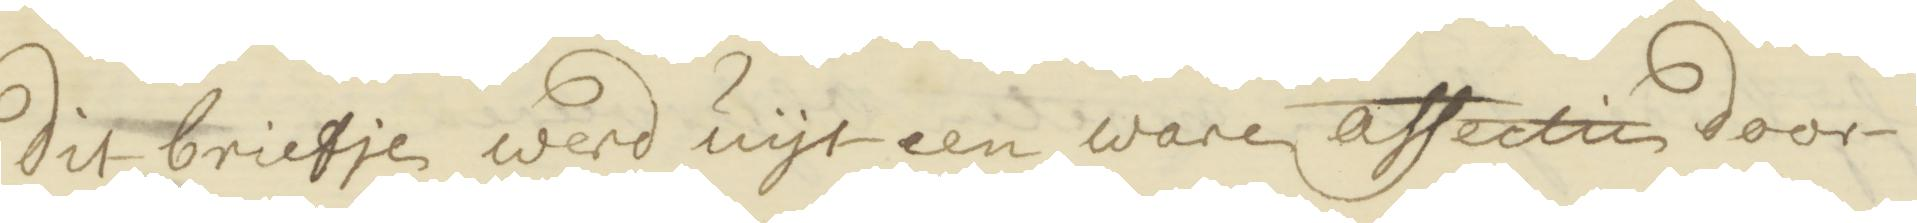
dit briefje werd uijt een ware affectie door
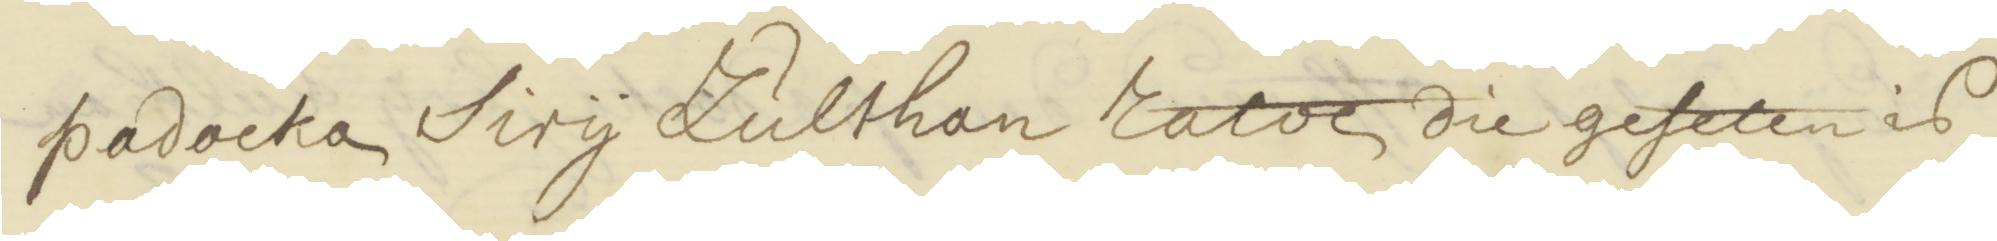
padoeka sirij Zulthan Ratoe die geseten is
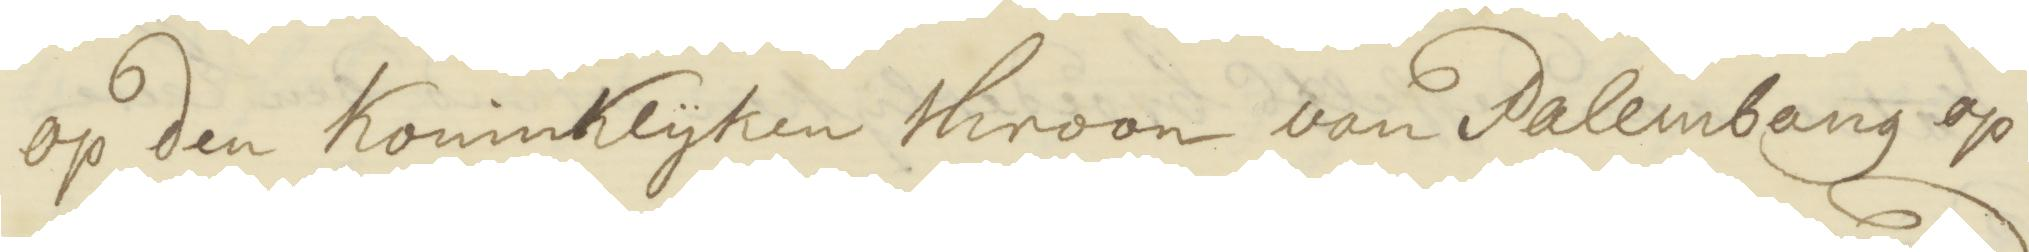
op den koninklijken throon van Palembang op
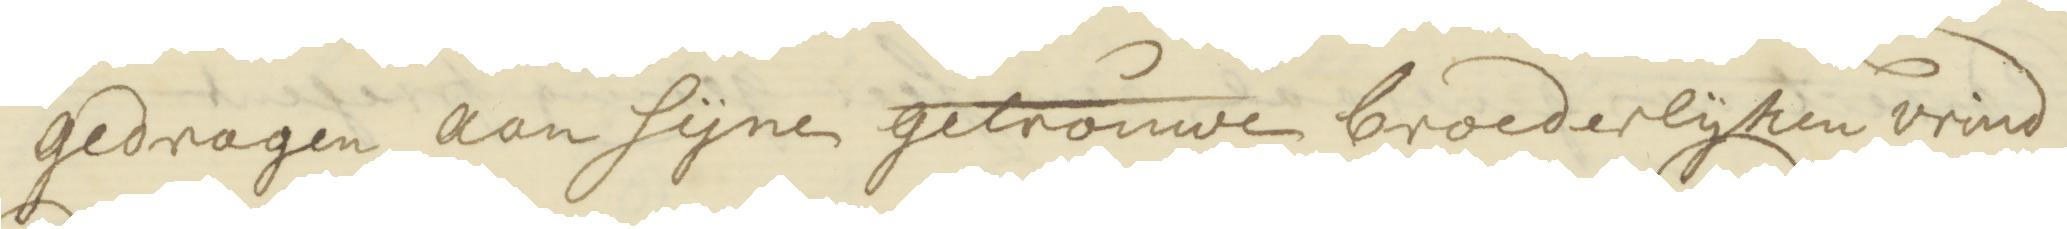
gedragen aan sijne getrouwe broederlijken vrind
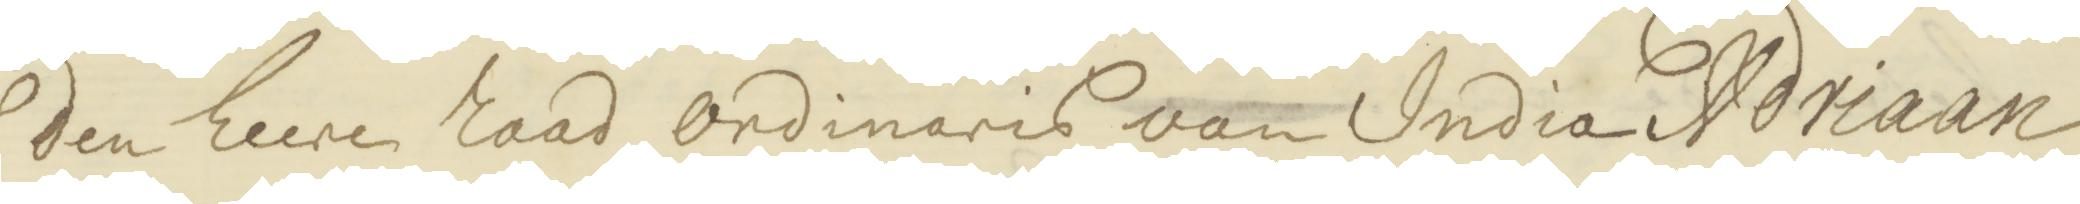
den heere raad ordinaris van India Adriaan
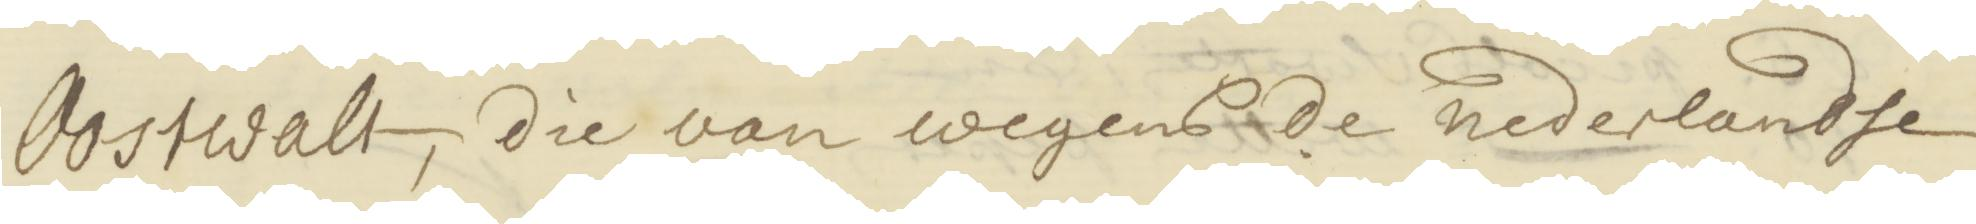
Oostwalt, die van wegens de nederlandse
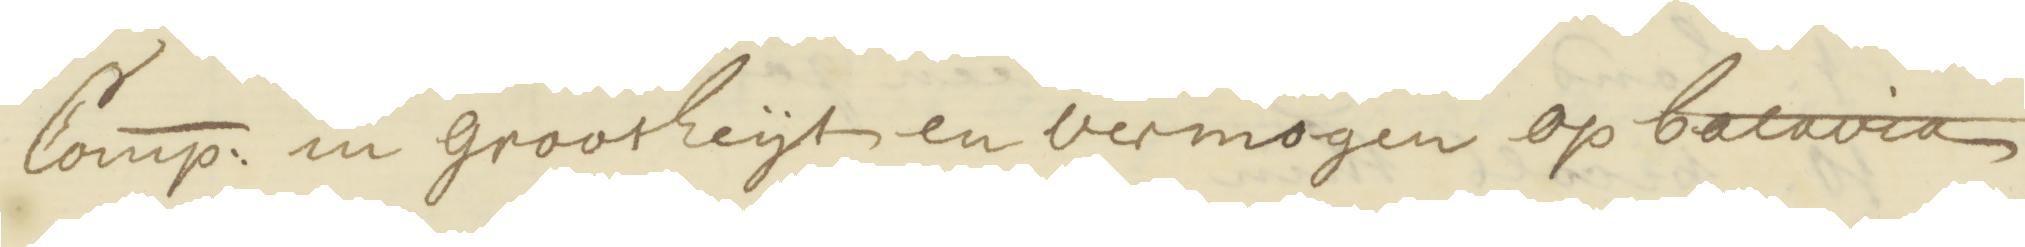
Comp: in grootheijt en vermogen op batavia
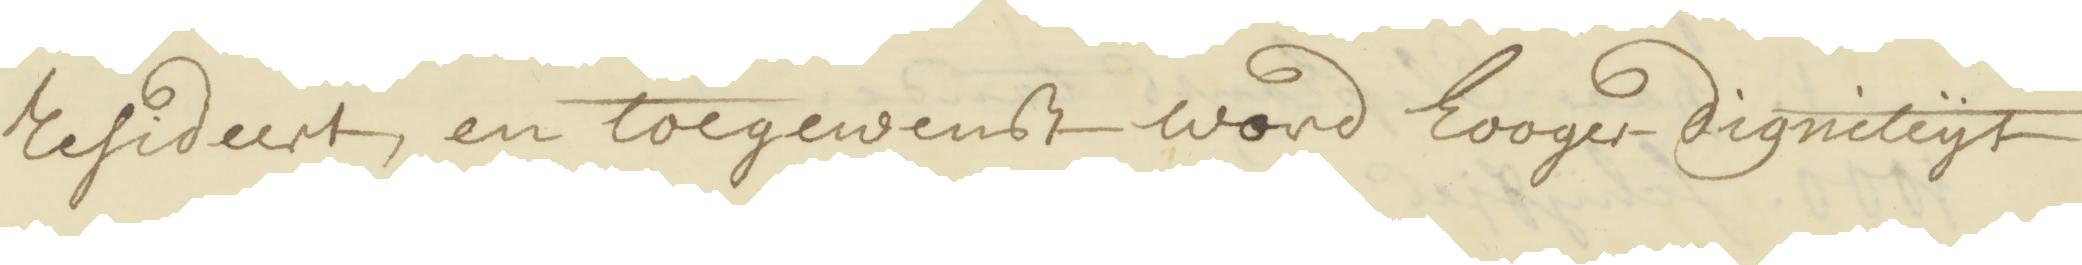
Resideert, en toegewenst word hooger digniteijt
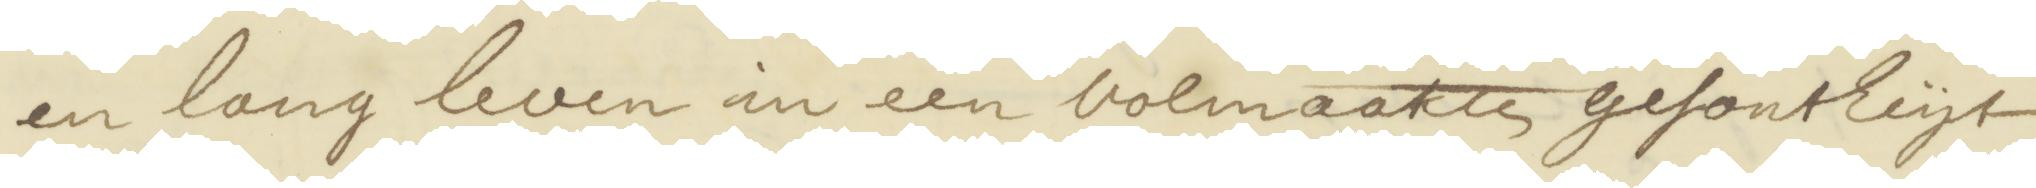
en lang leven in een volmaakte gesontheijt
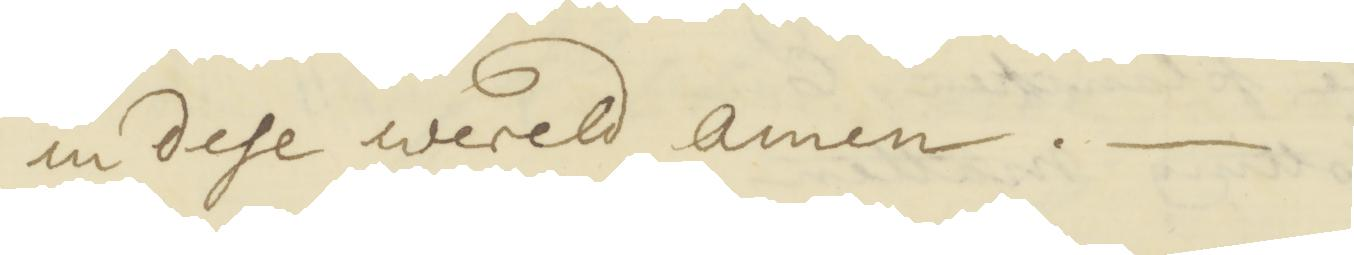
in dese wereld amen. —
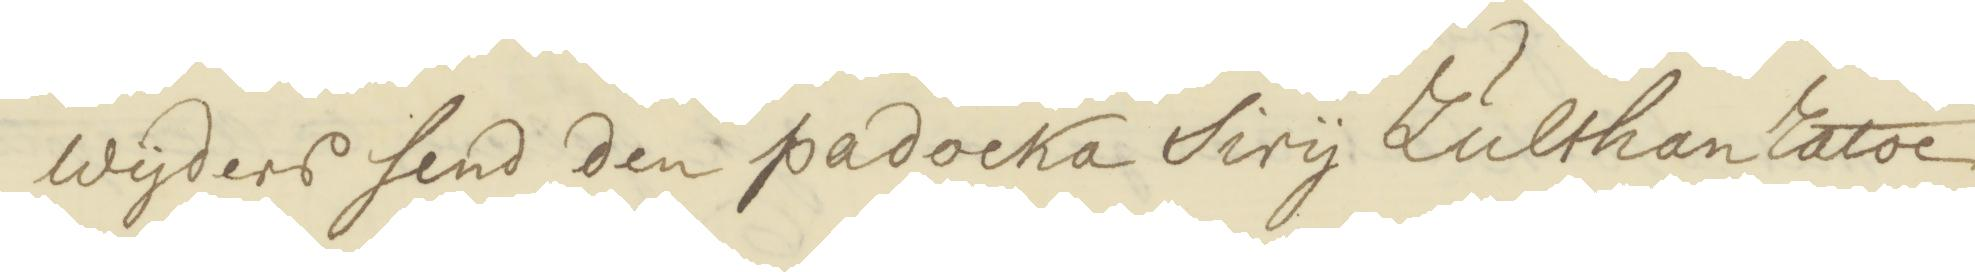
wijders send den padoeka sirij Zulthan Ratoe
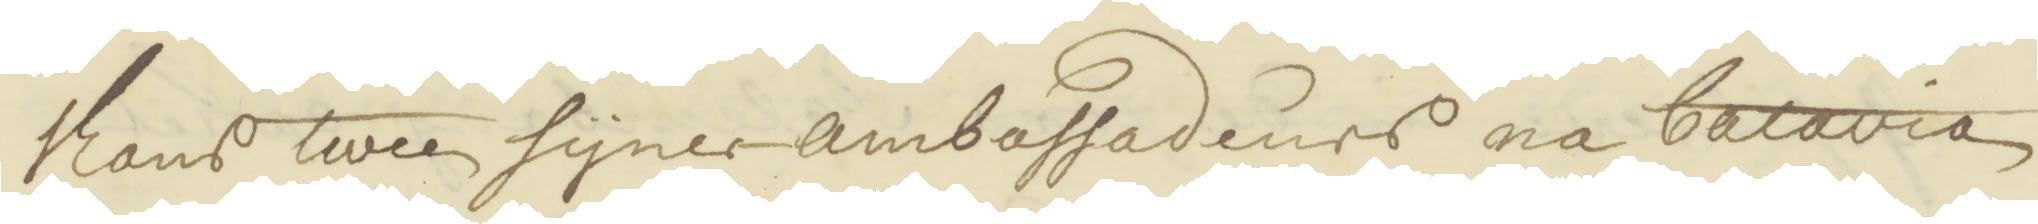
thans twee sijner ambassadeurs na batavia
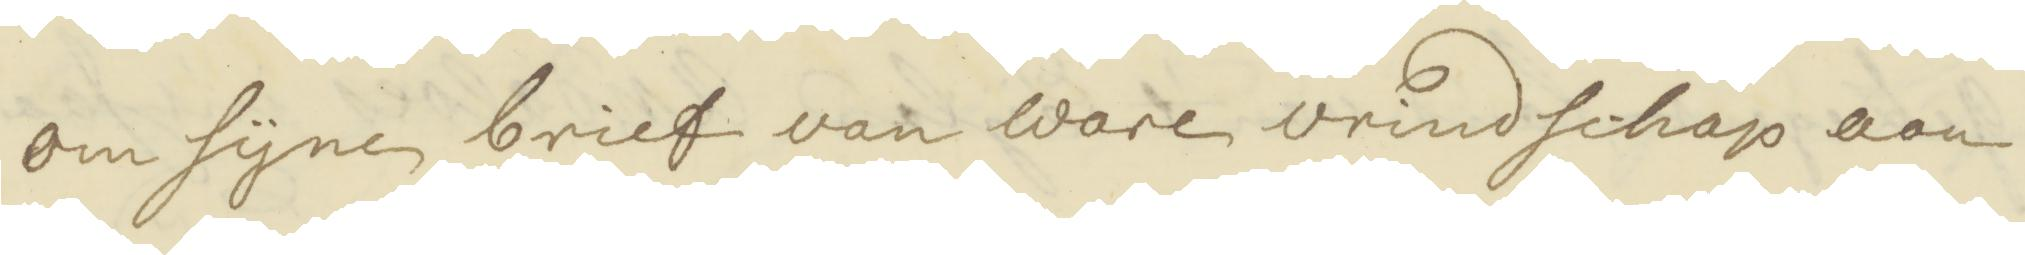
om sijne brief van ware vrindschap aan
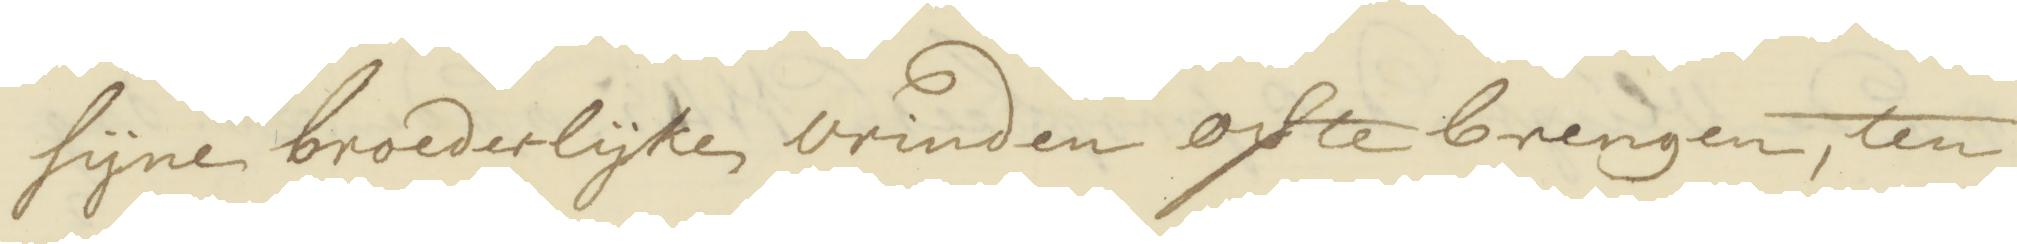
sijne broederlijken vrinden overte brengen, ten
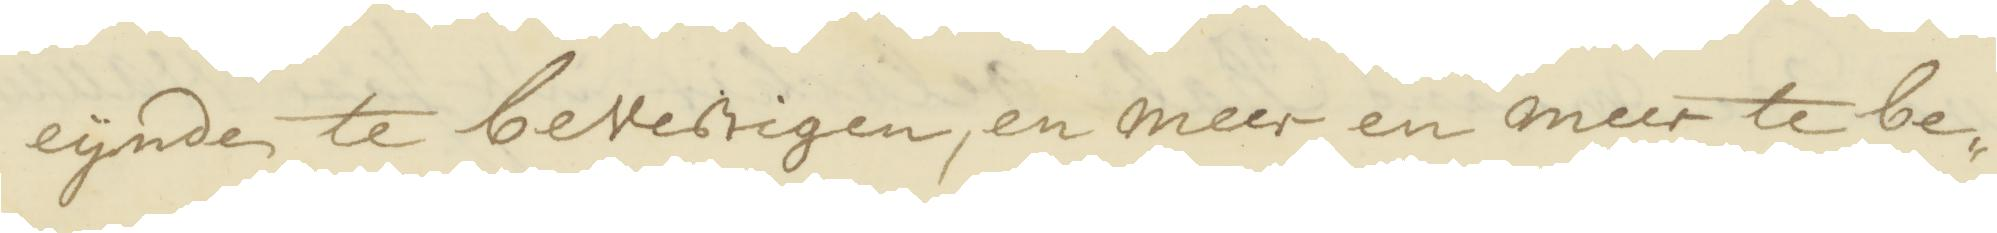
eijnde te bevestigen, en meer en meer te be„
